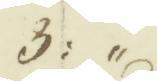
3: „
